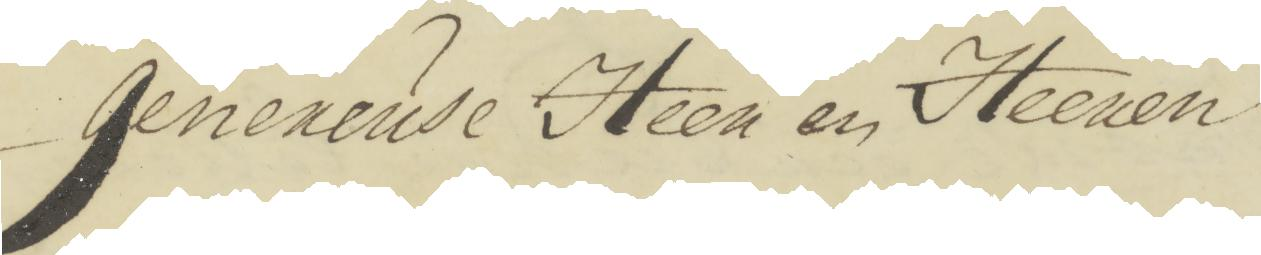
Genereuse Heer en Heeren
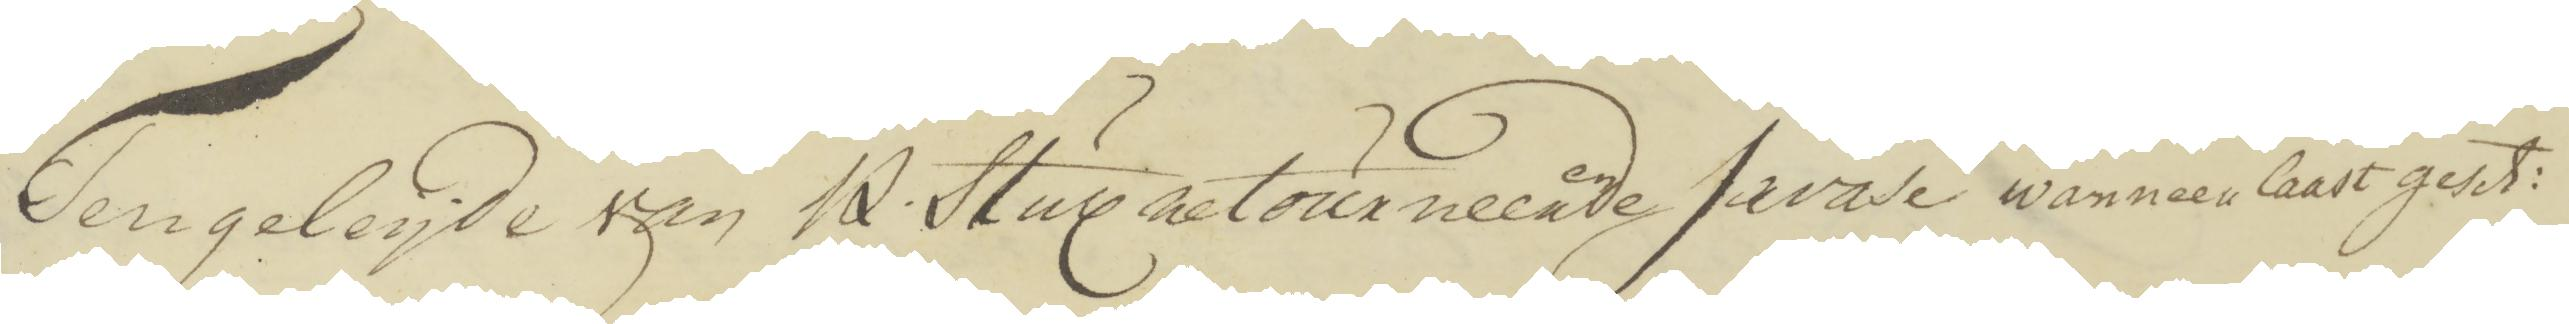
Ten geleijde van 12. stux retourneerende Javase wanneer laast gesch:
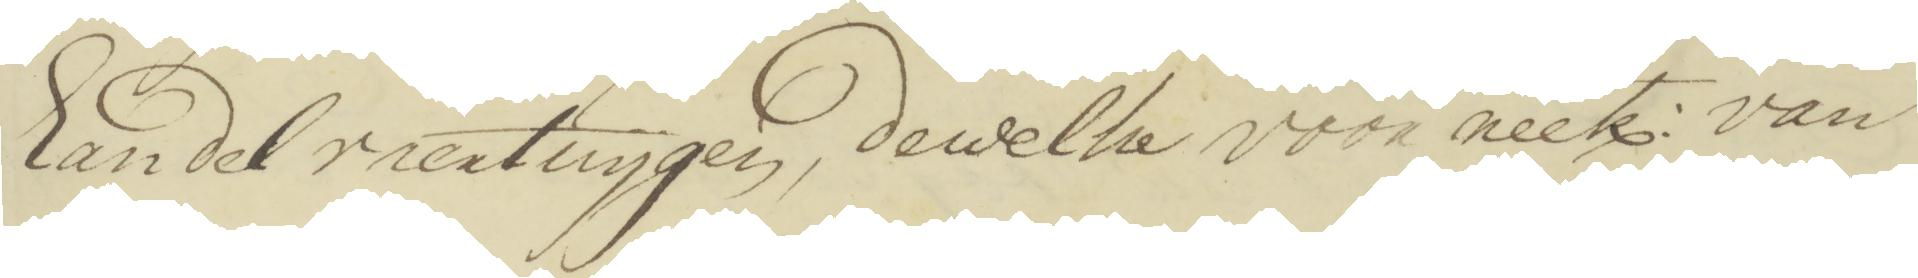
handel vaertuijgen, dewelke voor reek: van
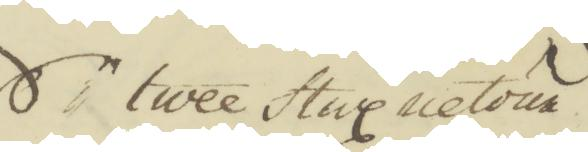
d' twee stux retour
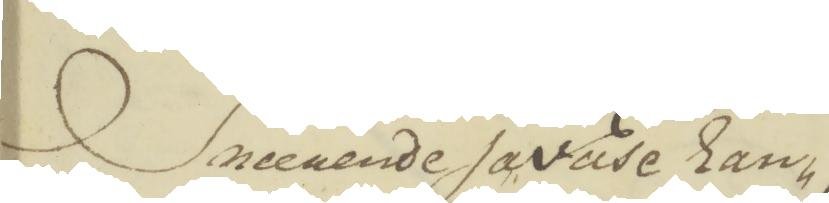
neerende Javase han„
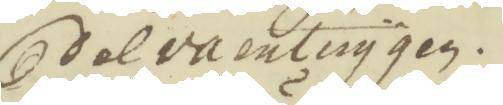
del vaertuijgen.
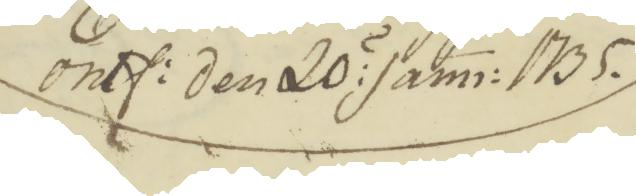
ontf: den 20:' Jann: 1735.
